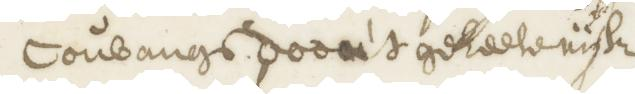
Coubangs door 't geheele rijk
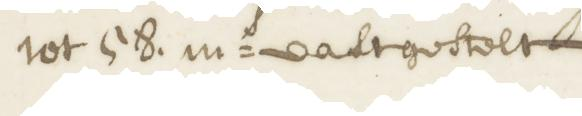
tot 58. m=s vastgestelt
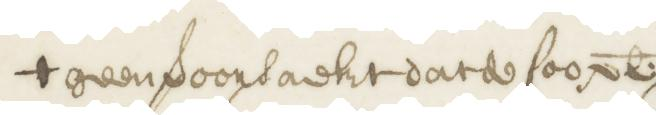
t geen veroorsaekt dat de Coopl:
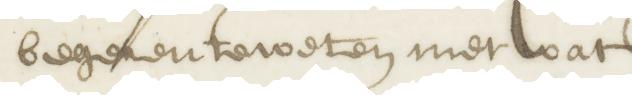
begeren teweten met wat
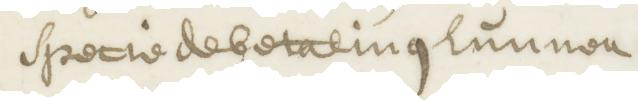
specie de betaling hunnen
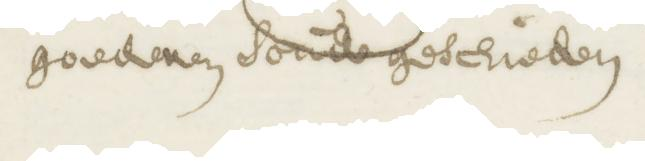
goederen soude geschieden
